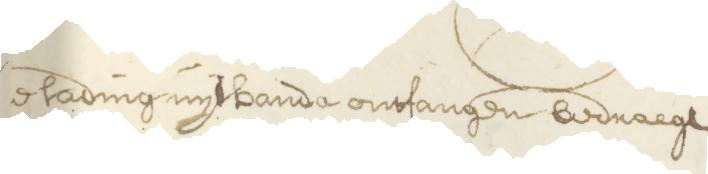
e lading uijt banda ontfangen bedraegt
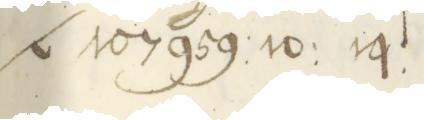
ƒ107959:10:14.
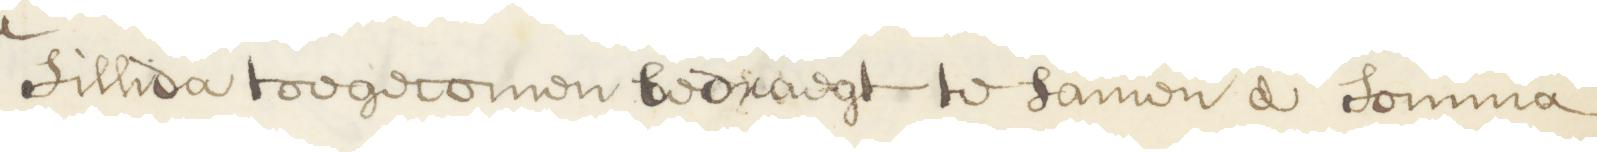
Sillida toegecomen bedraegt te samen de somma
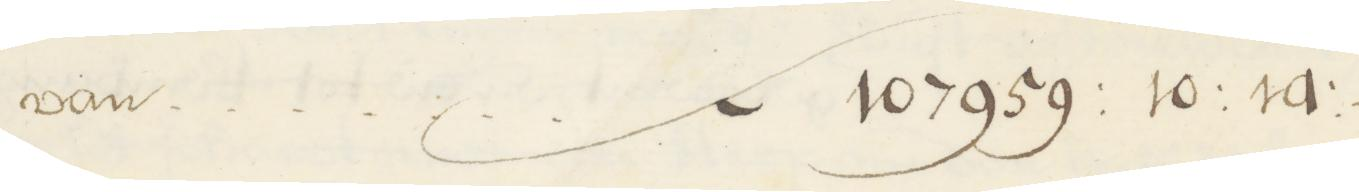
van ƒ107959:10:14:
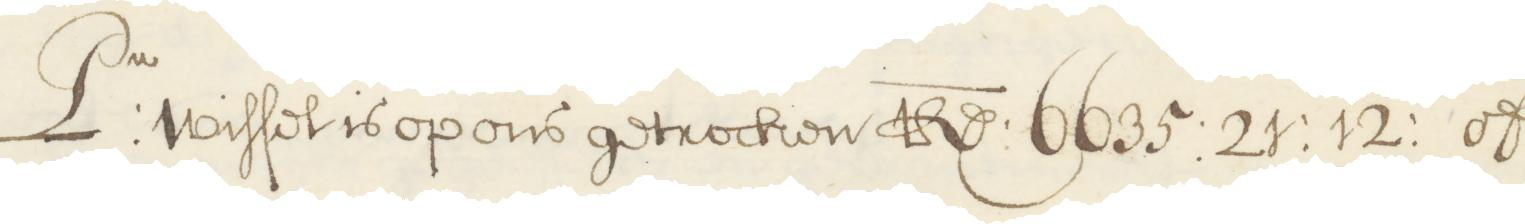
P:r wissel is op ons getrocken RE: 6635: 21:12: of
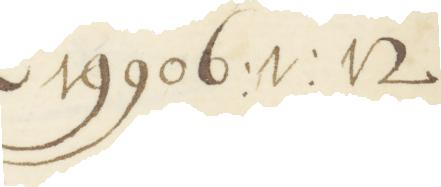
ƒ19906:1:12
